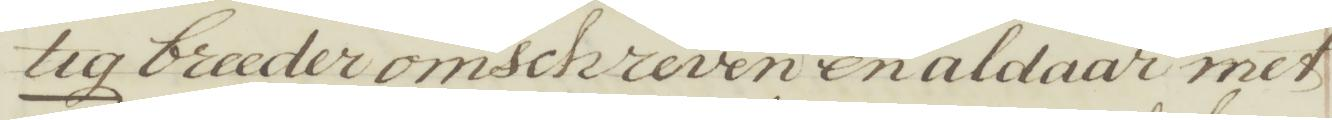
tig breeder omschreven en aldaar met
